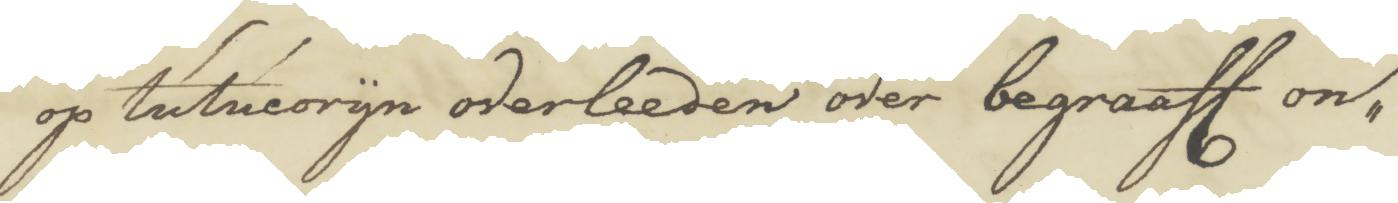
op tutucorijn overleeden over begraaff on„
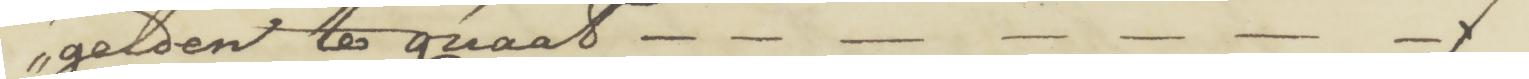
„gelden te quaat — — — — — — —ƒ
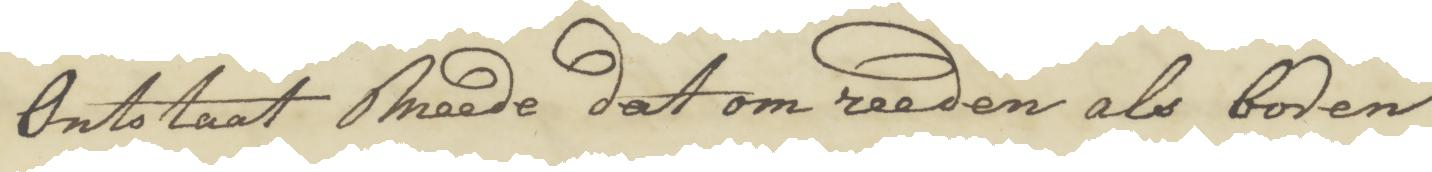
Ontstaat meede dat om reeden als boven
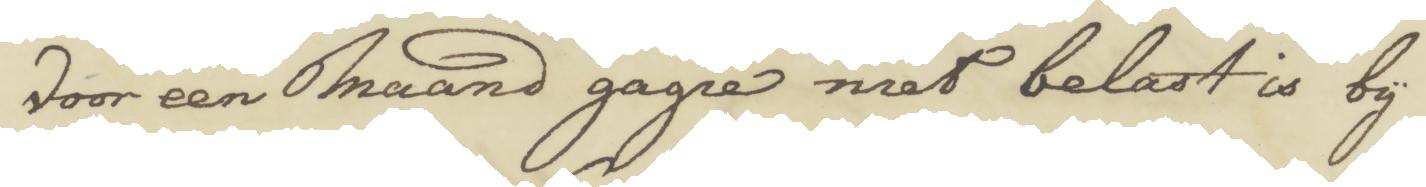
voor een maand gagie niet belast is bij
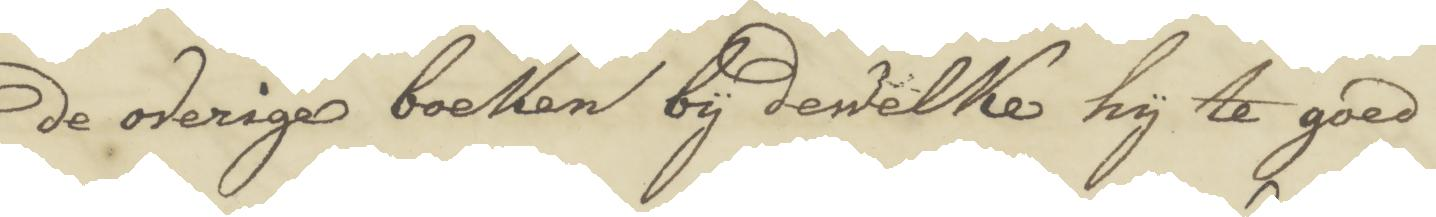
de overige boeken bij dewelke hij te goed
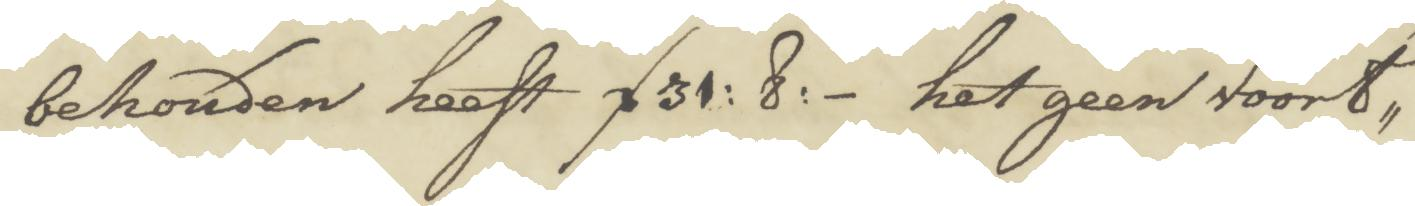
behouden heeft ƒ31: 8:— het geen voort„
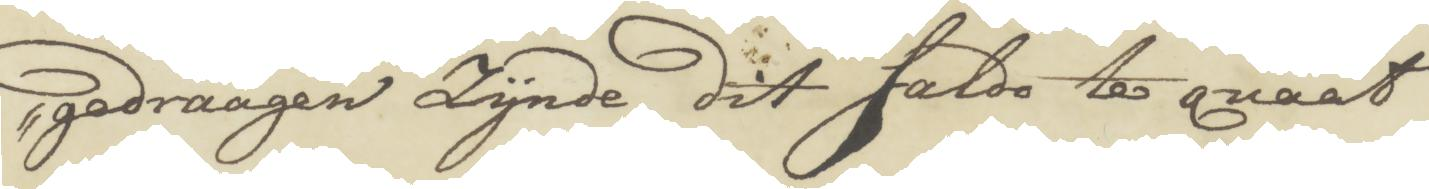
„gedraagen zijnde dit saldo te quaat
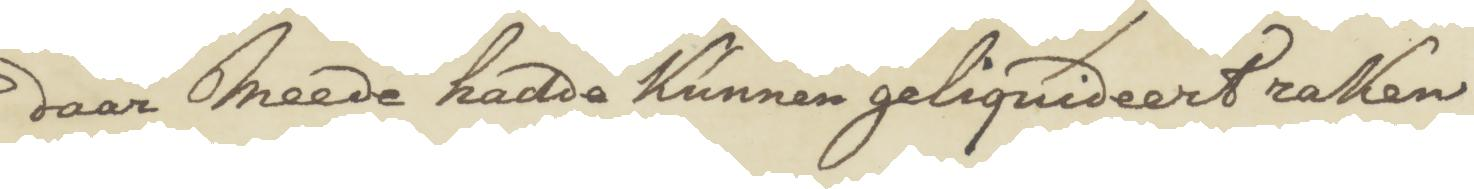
daar meede hadde kunnen geliquideert raken
